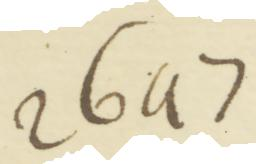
2647
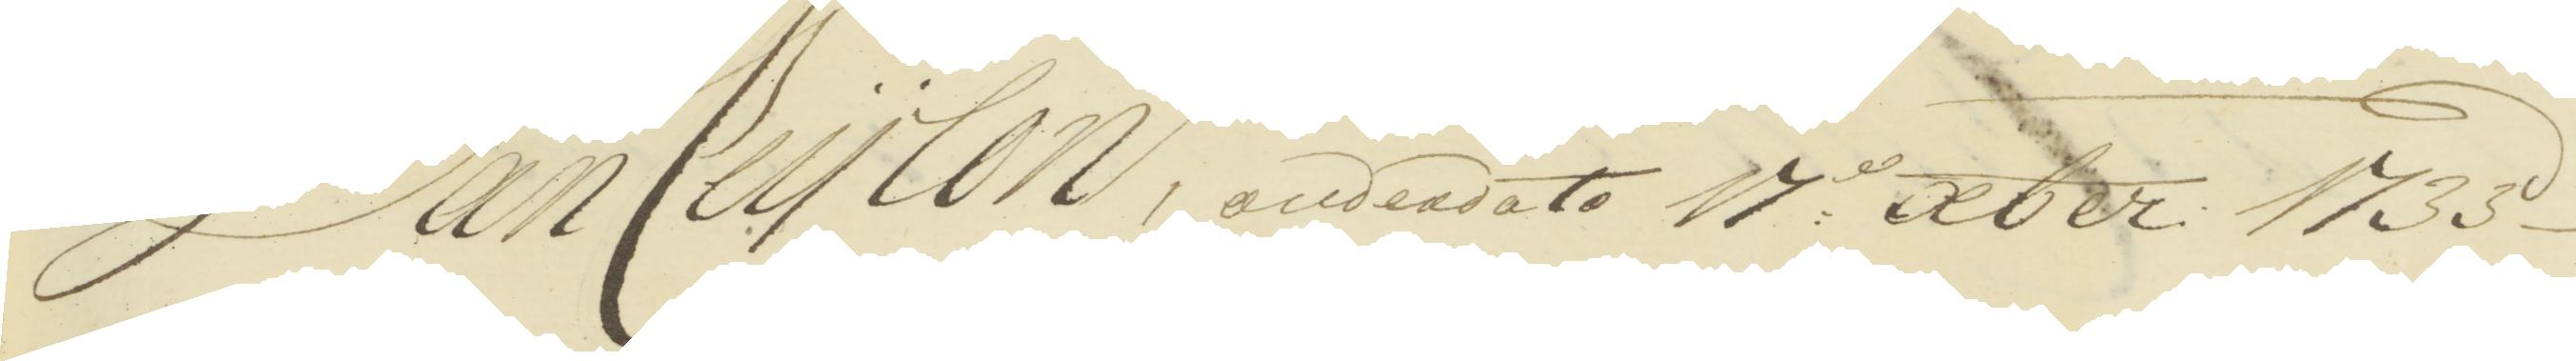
Van Ceijlon, onderdato 17:e xber: 1735 -
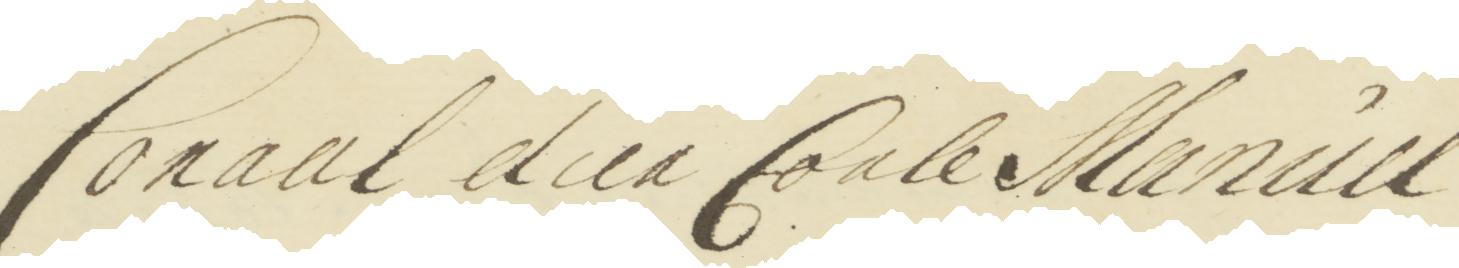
Coraal dier Corle Manuel
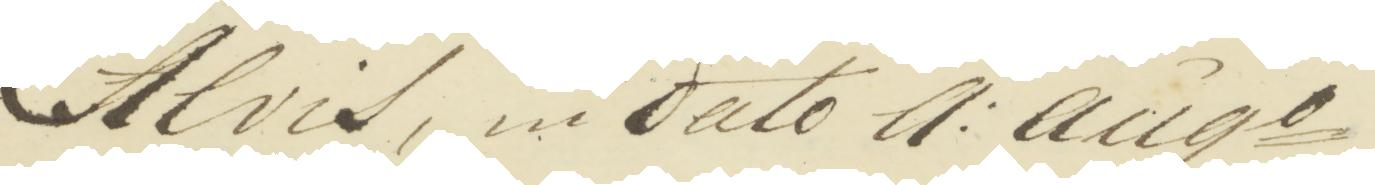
Alvis, in dato 4: Aug=o
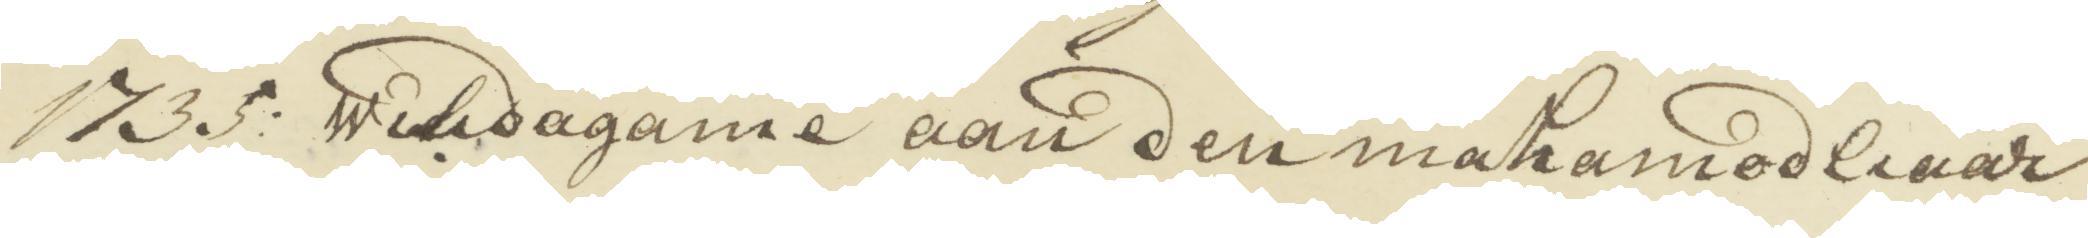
1735: wilidagame aan den mahamodhaar
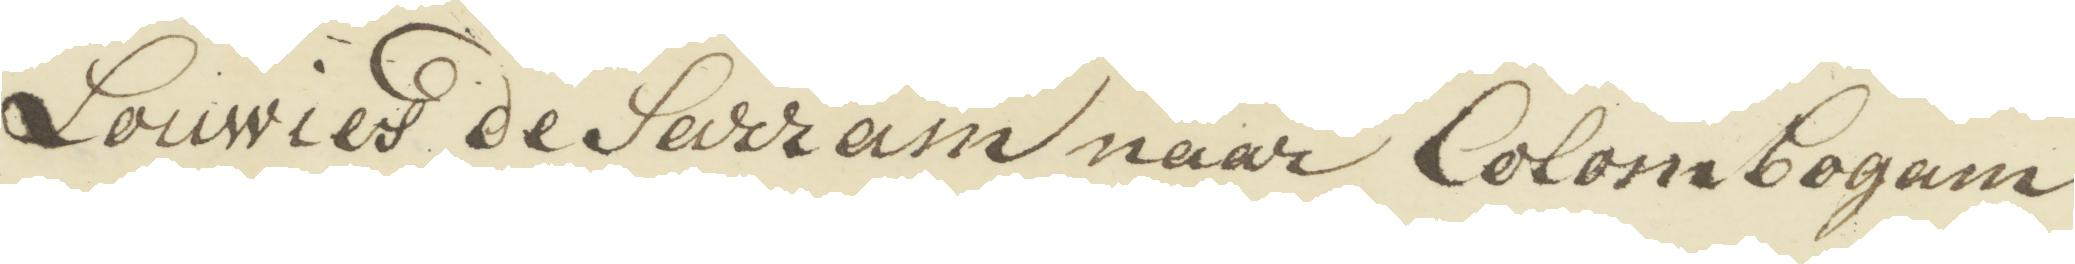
Louwies de Sarram naar Colombogam
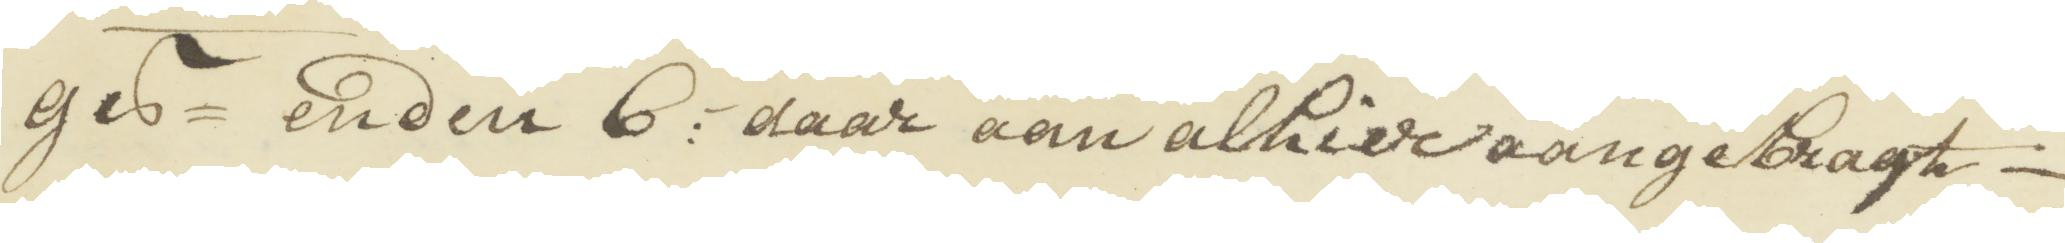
ges= enden 6: daar aan alhier aangekragt —
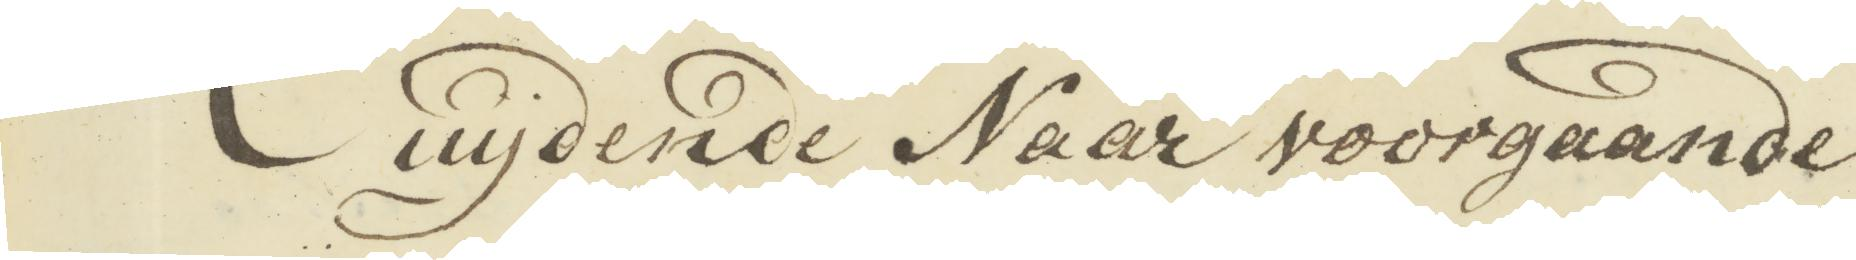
Luijdende Naar voorgaande
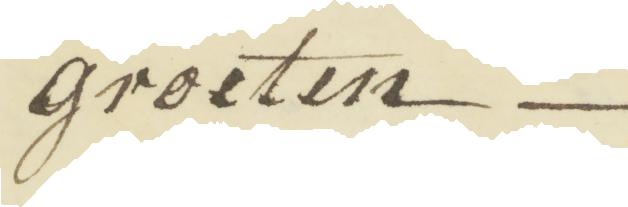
groeten —
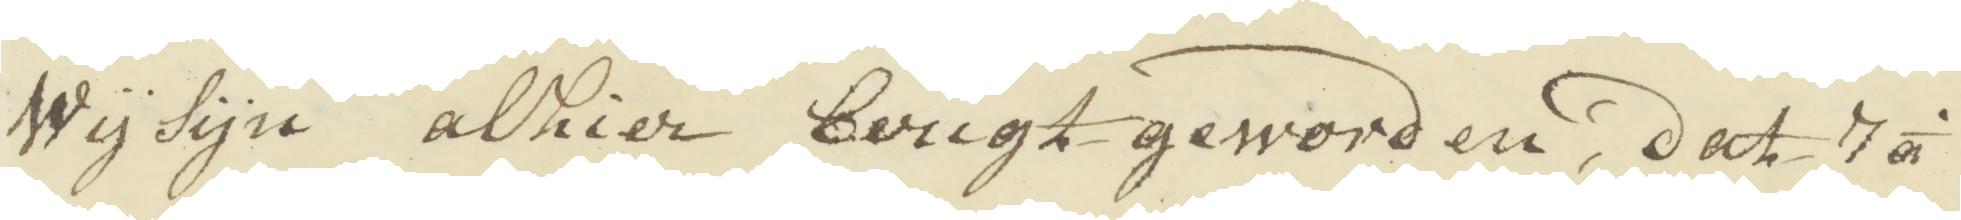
wij sijn alhier berigt geworden, dat 7 à
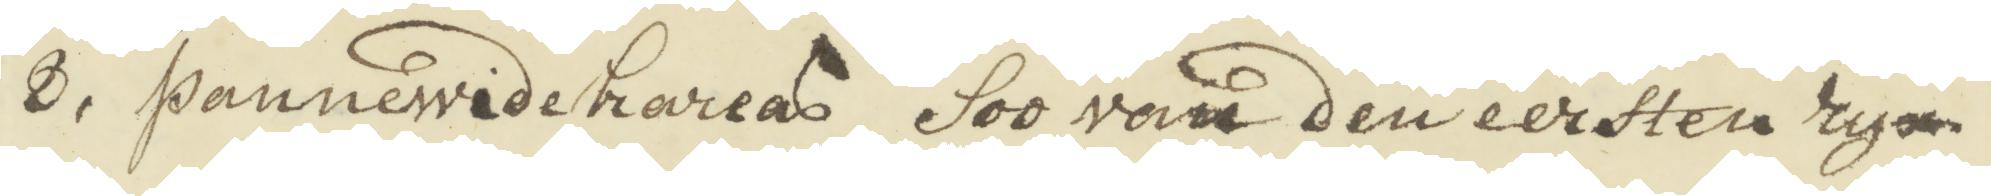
8. pannewide karcas soo van den eersten rya
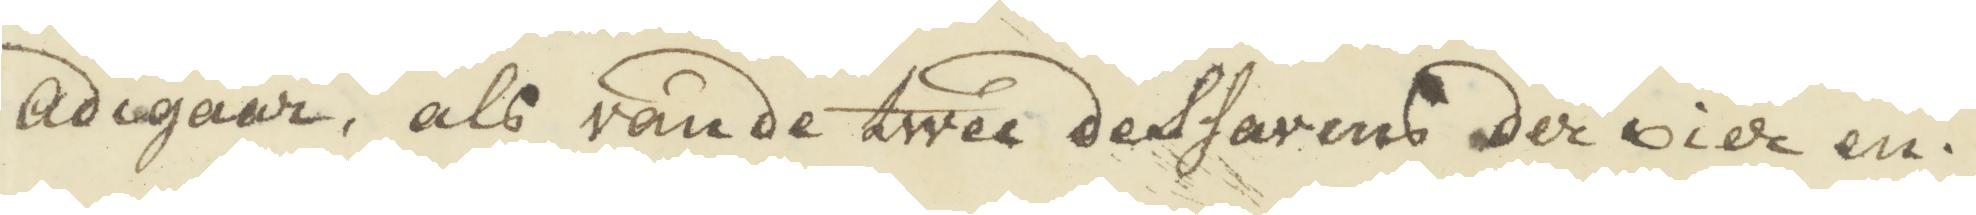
adigaar, als van de twee dessavens der vier en.
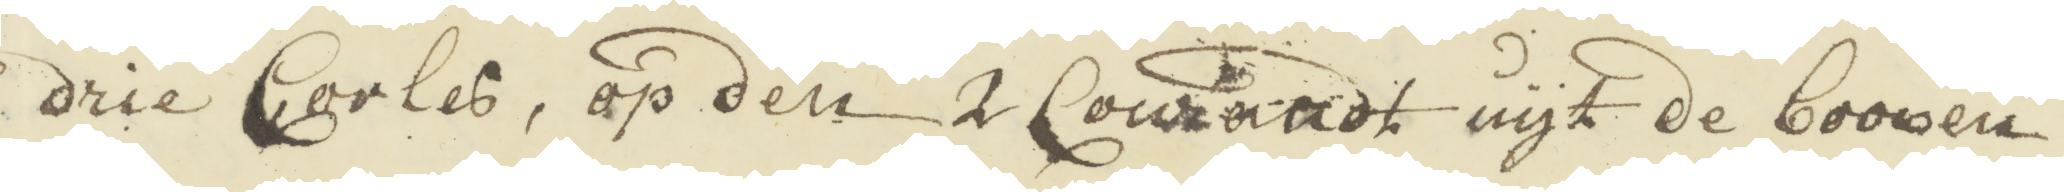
drie Corles, op den 2 Courandt uijt de booven
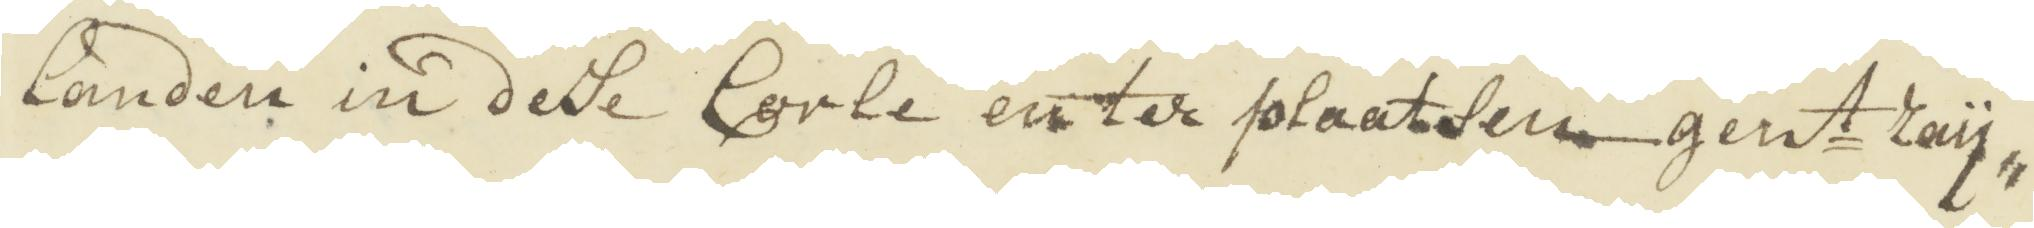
landen in dese Corle en ter plaatsen gen=t raij„
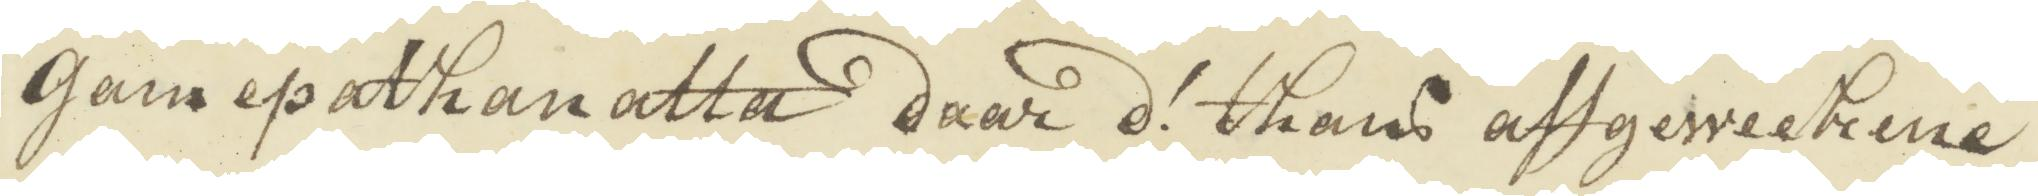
gamepathanatta daar d' thans affgeweekene
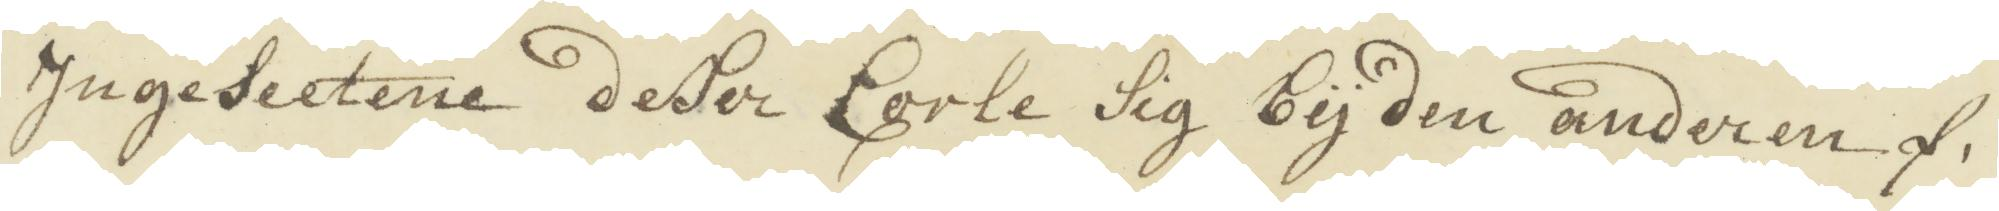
Jngeseetene deser Corle sig bij den anderen ver„
